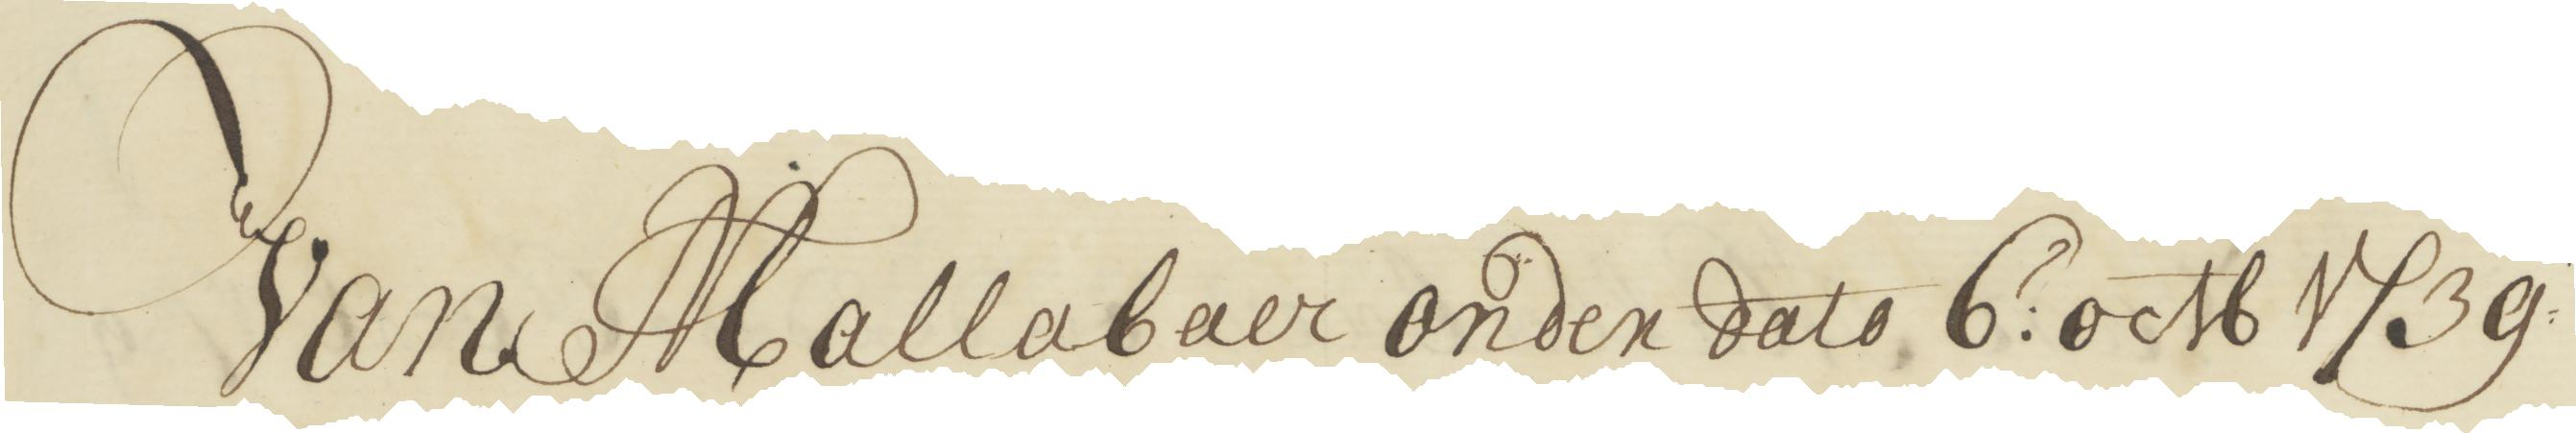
Van Mallabaer onder dato 6:' octb 1739:
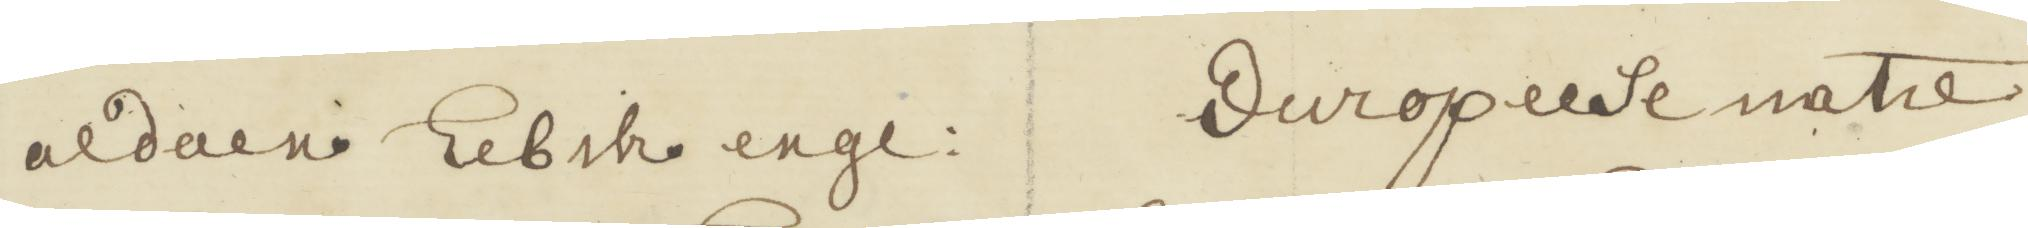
aldaer heb ik erge: Europeese natie
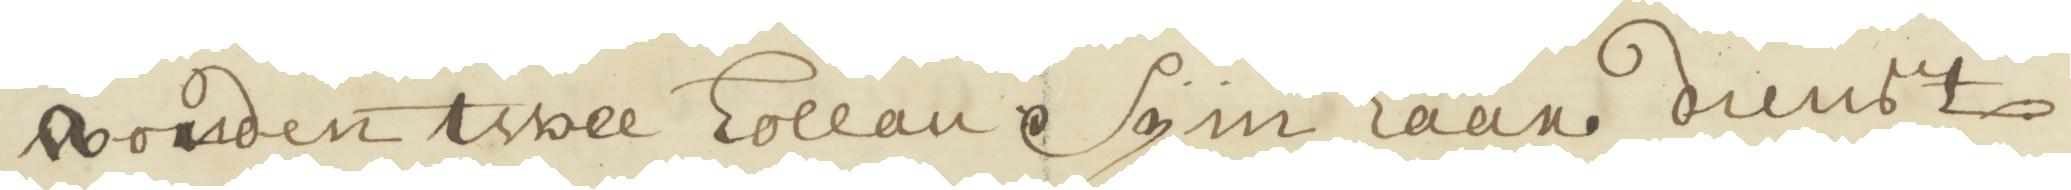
vonden twee hollan sy in haar dienst
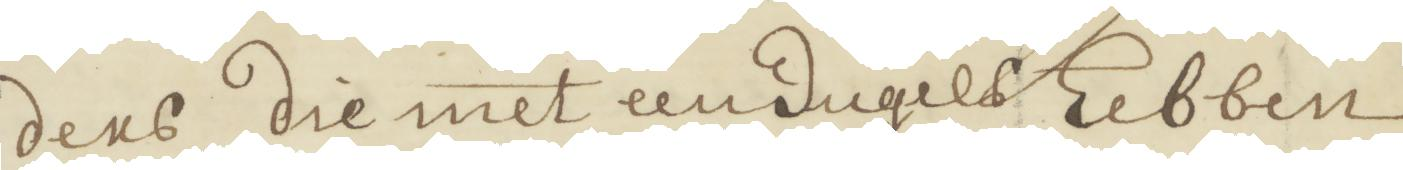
ders die met een Engels hebben
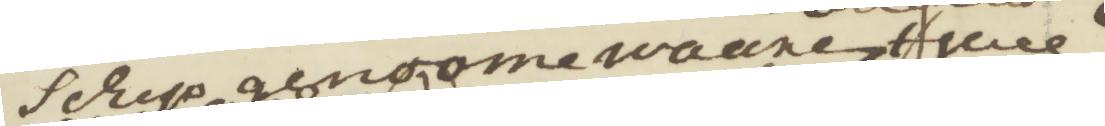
Schip genoome waaren twee
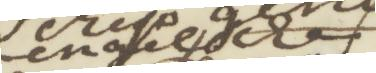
engelsche
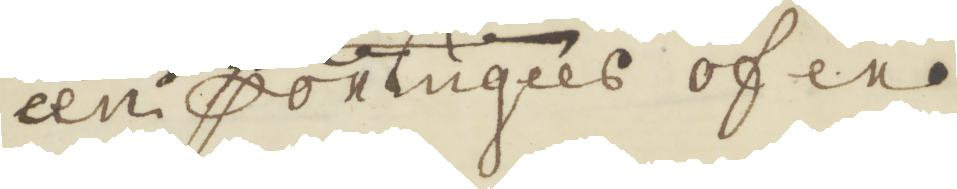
een portugees of er
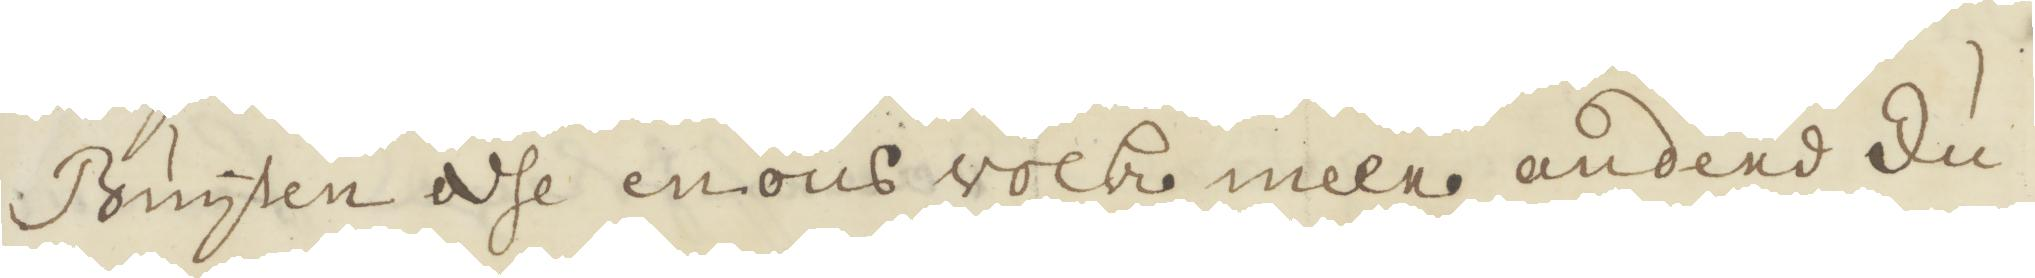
Buijten dese en ons volk meer andere Eu
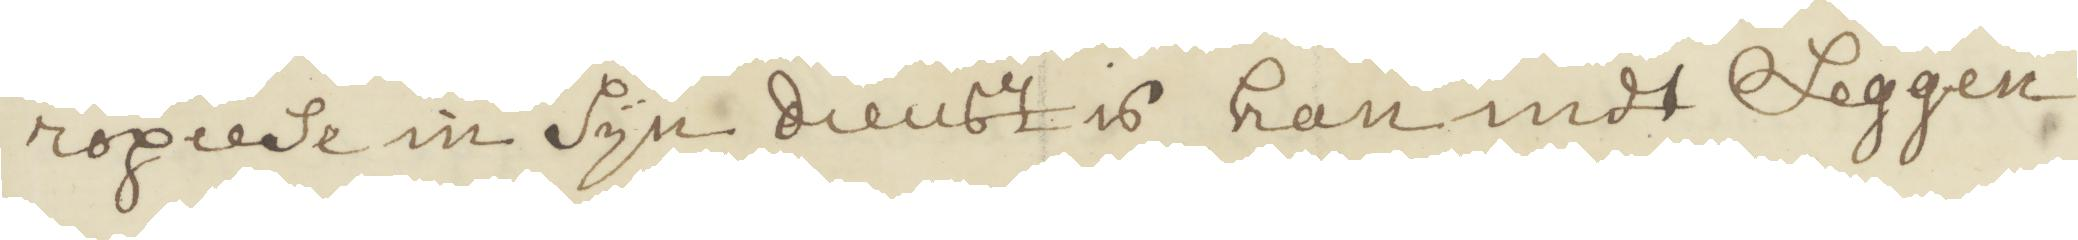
ropeese in sijn dienst is kan niet seggen
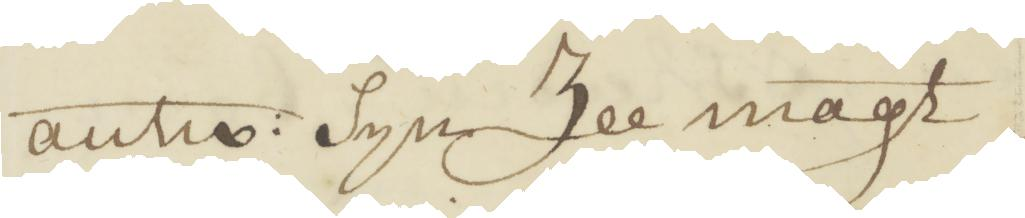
antw: sijn Zee magt
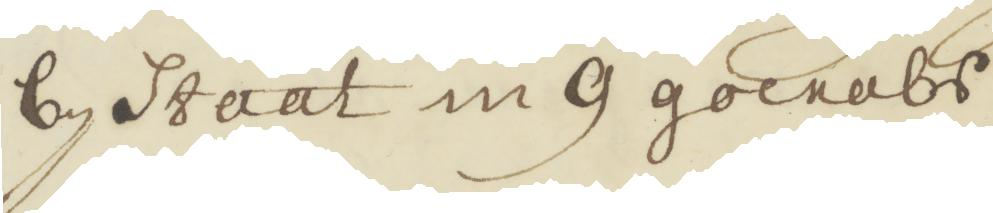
by staat in 9 goerabs
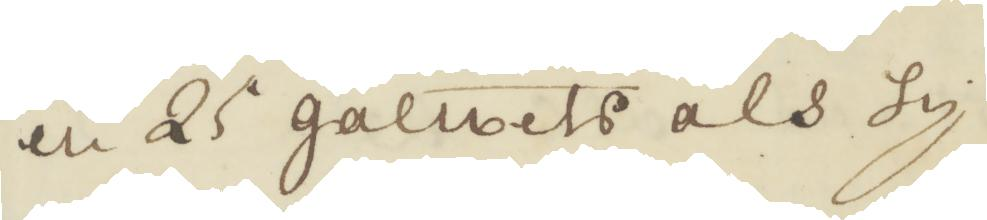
en 25 galwets als sij
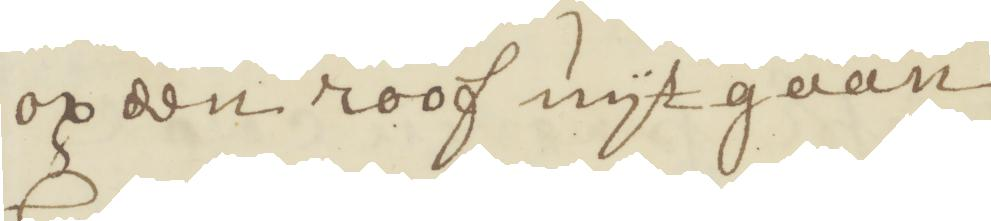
op den roof uijt gaan
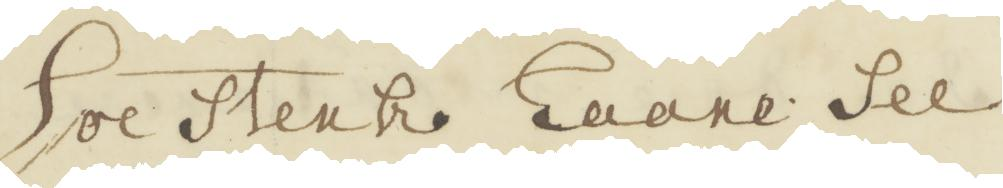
hoe sterk haare see
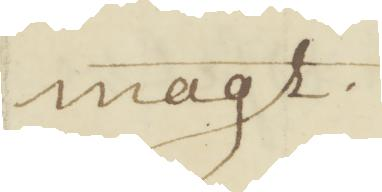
magt.
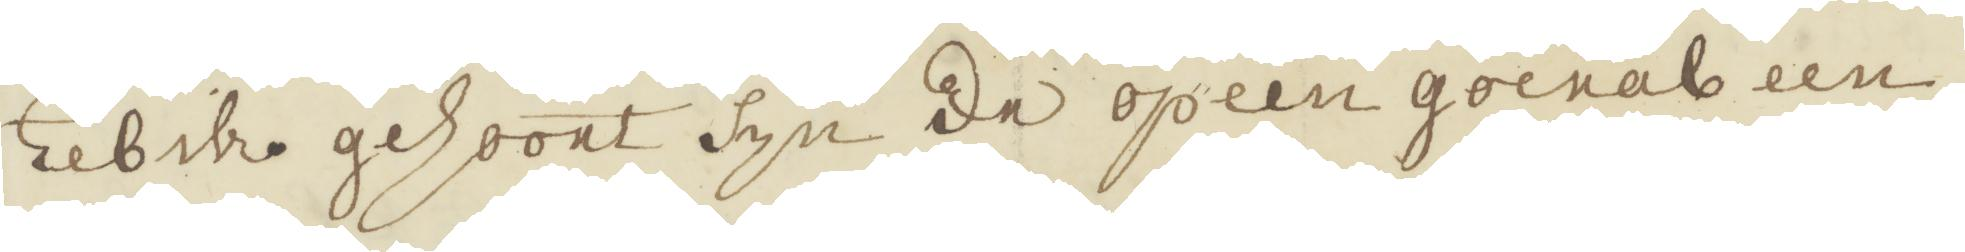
heb ik gehoort sijn Er op een goerab een
